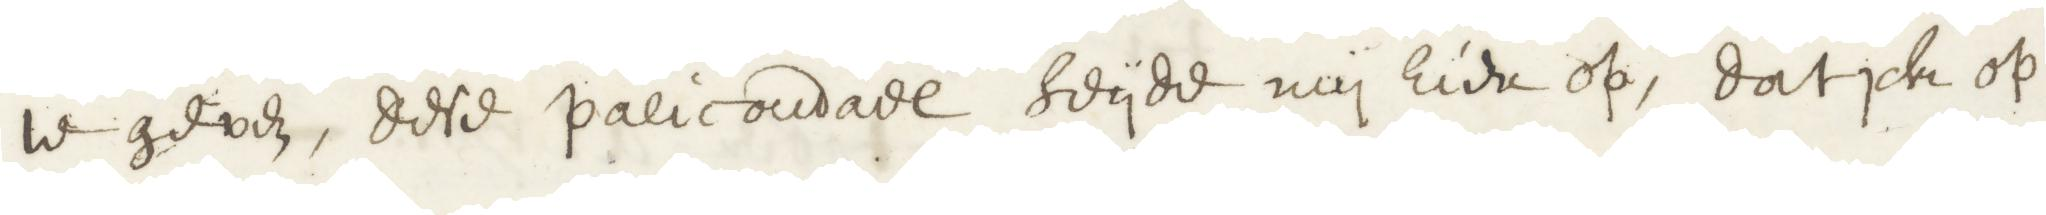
te geven, dese palicondael seijde mij hier op, dat jck op
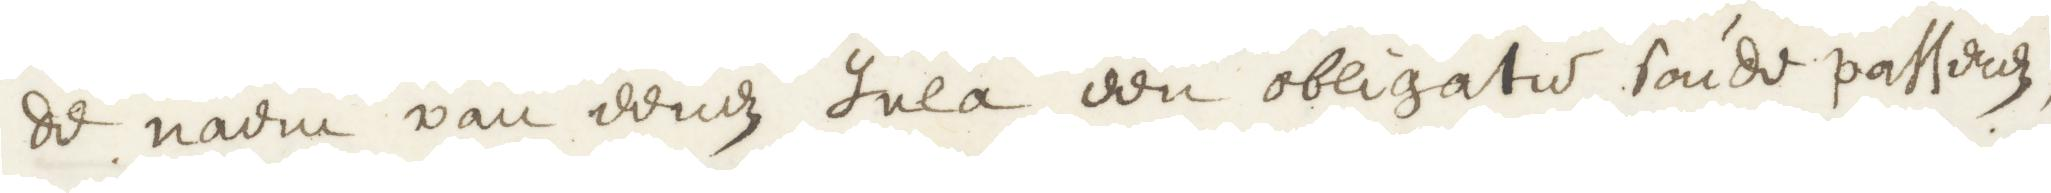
de naem van eenen Irla een obligatie soude passeren,
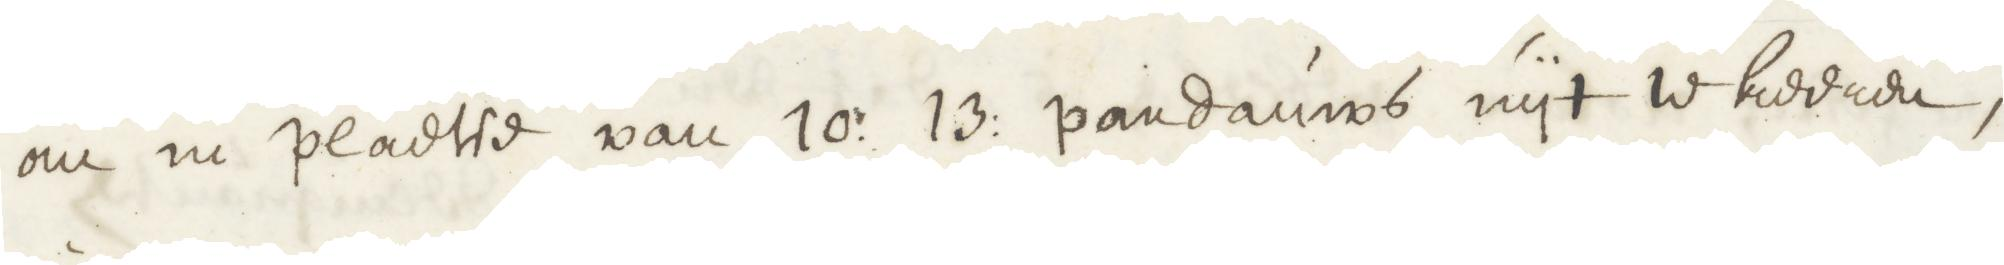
om in plaetse van 10: 13: pardauws uijt te keeren,
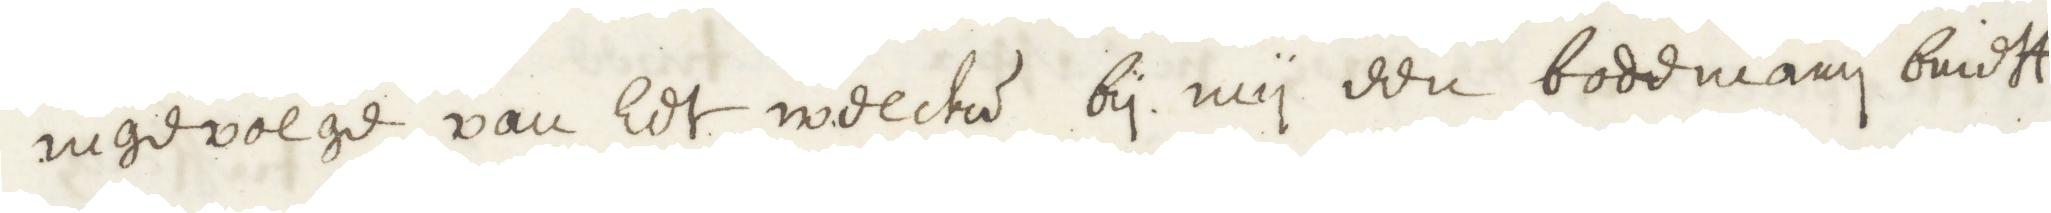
ingevolge van het welcke bij mij een bodemarij brieff
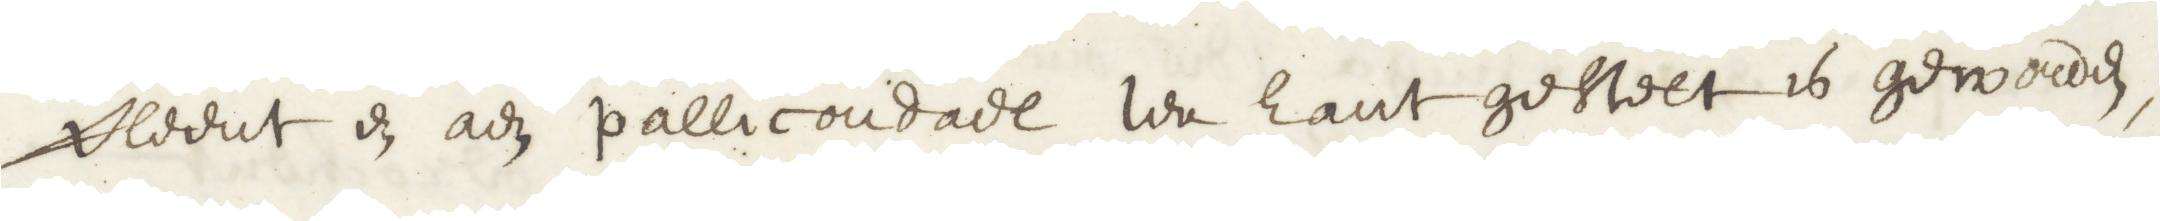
verleent en aen pallicondael ter hant gestelt is geworden,
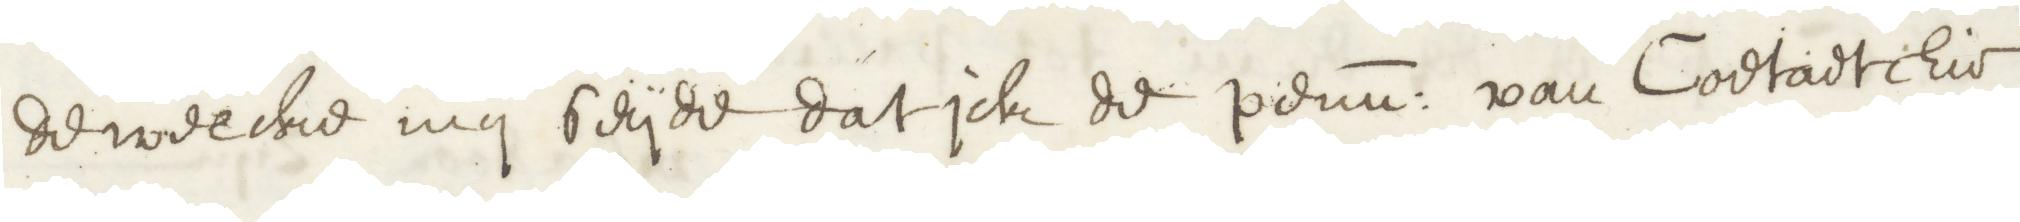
de welcke mij seijde dat jck de penn: van Coetaetchie
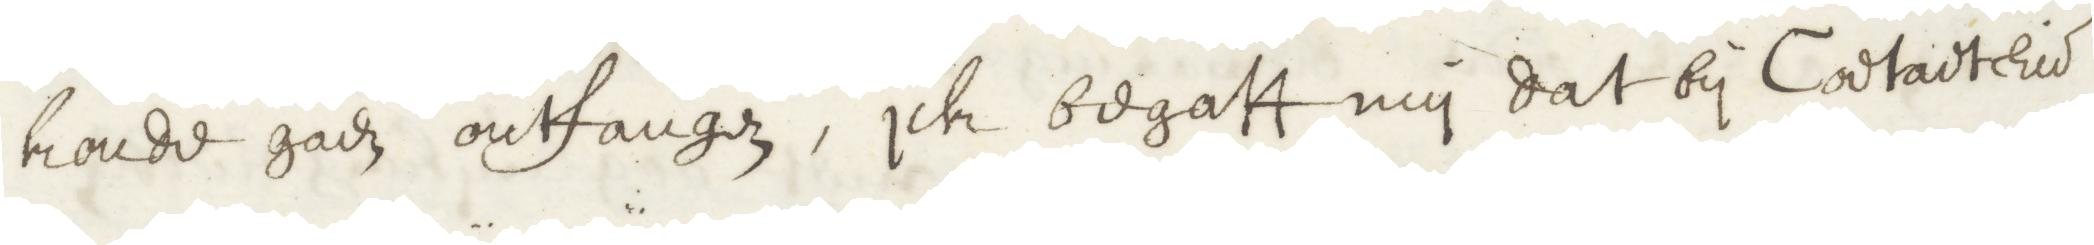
konde gaen ontfangen, jck begaff mij dat bij Coetaetchie
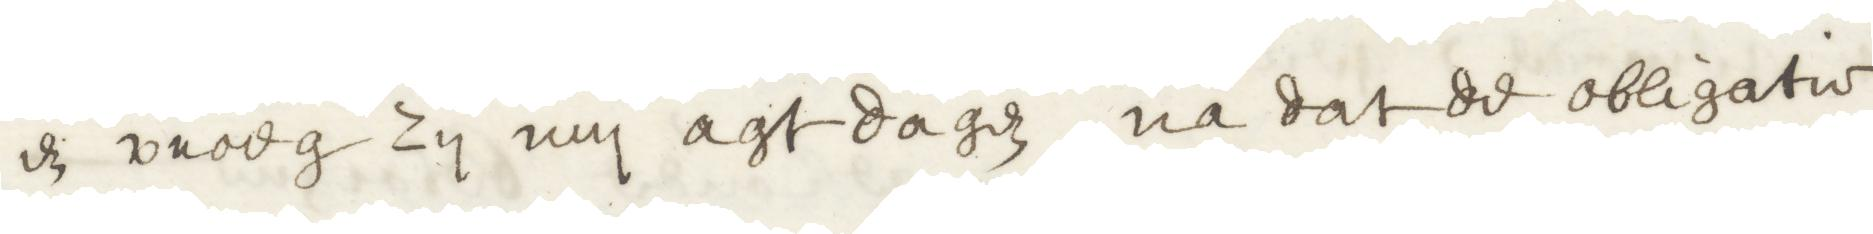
en vroeg zij mij agt dagen na dat de obligatie
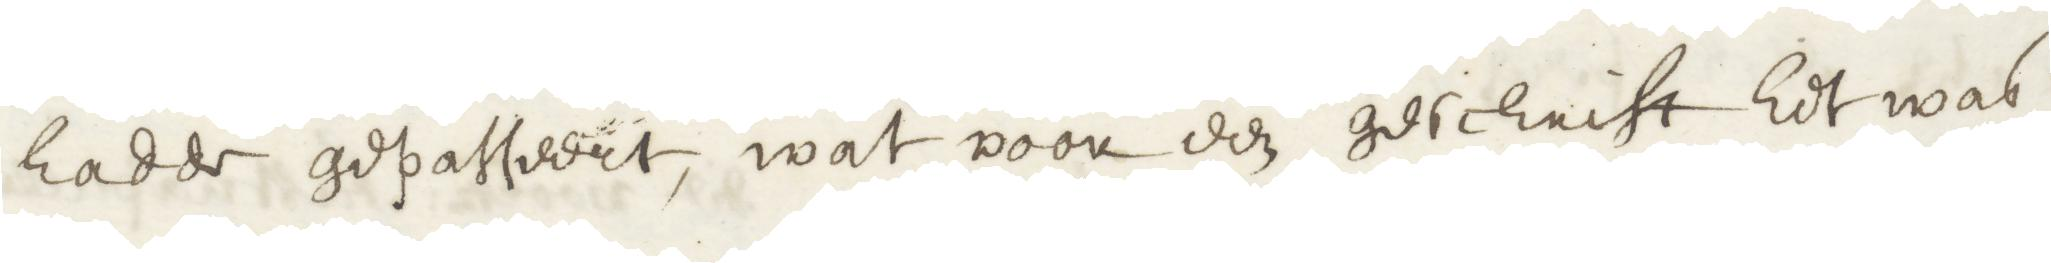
hadde gepasseert, wat voor een geschrift het was
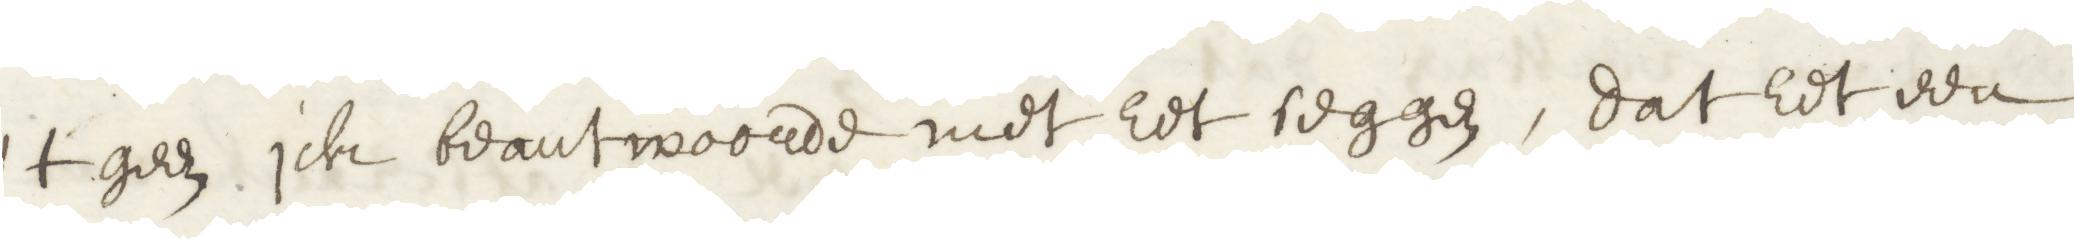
’t geen jck beantwoorde met het seggen, dat het een
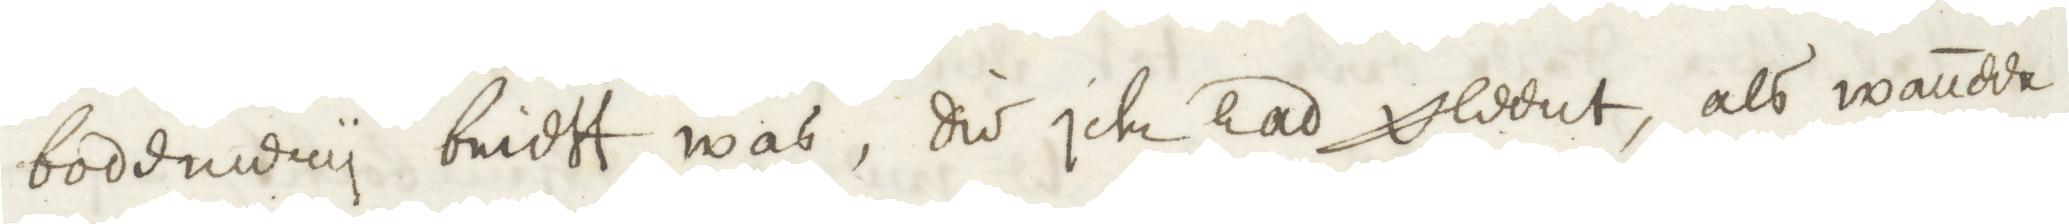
bodemerij brieff was, die jck had verleent, als waneer
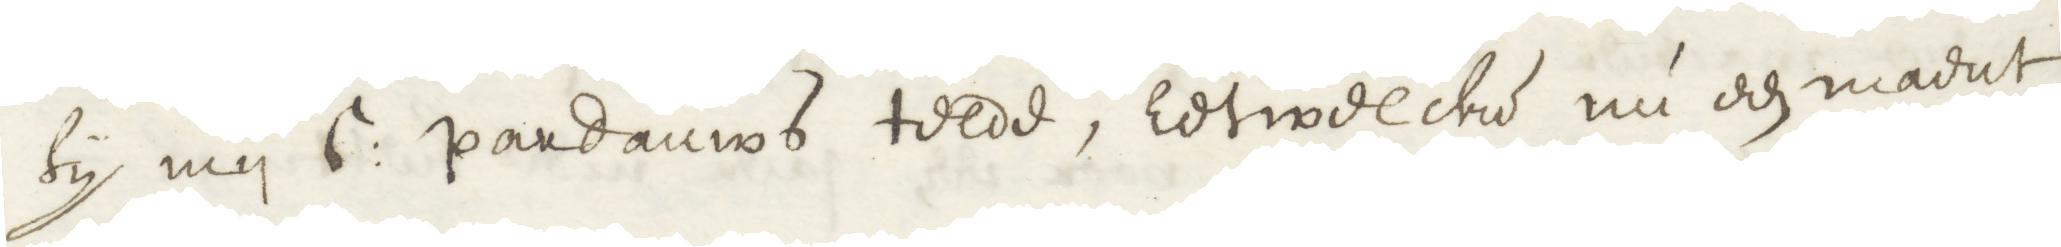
sij mij 5: pardauws telde, het welcke nu een maent
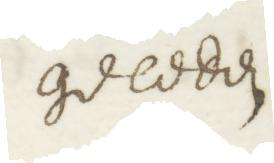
geleden
